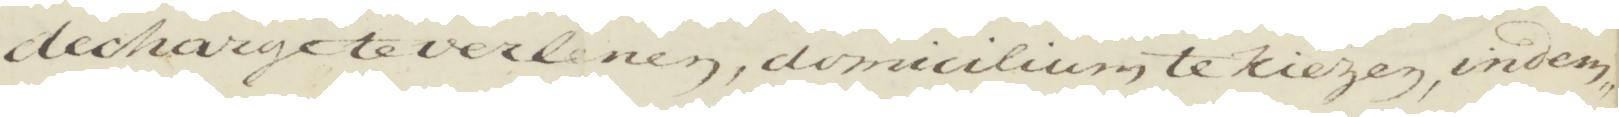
decharge te verlenen, domicilium te kiezen, indem„
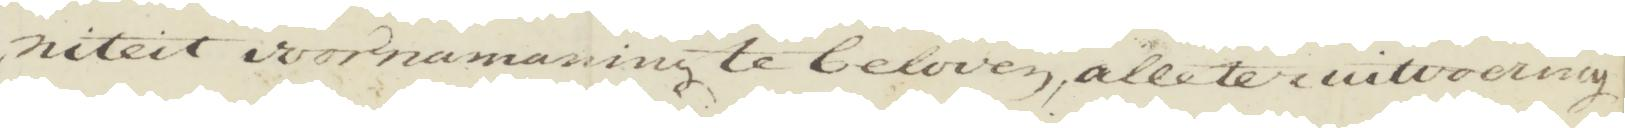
„niteit voor namaning te beloven, alle ter uitvoering
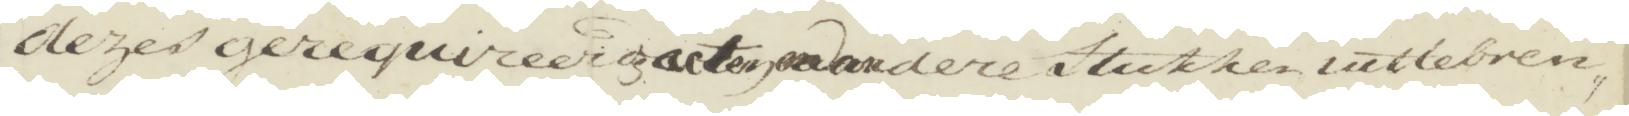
dezes gerequireerde acten en andere stukken uittebren„
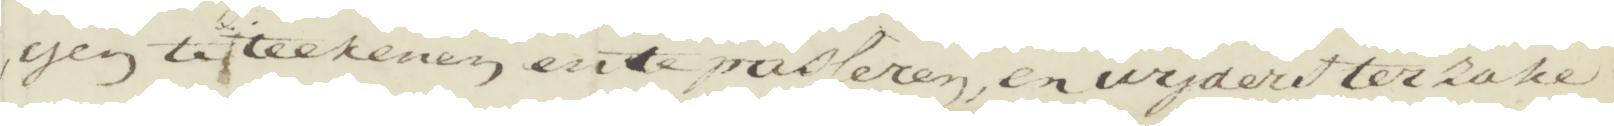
gen te teekenen en te passeren, en wyders ter zake
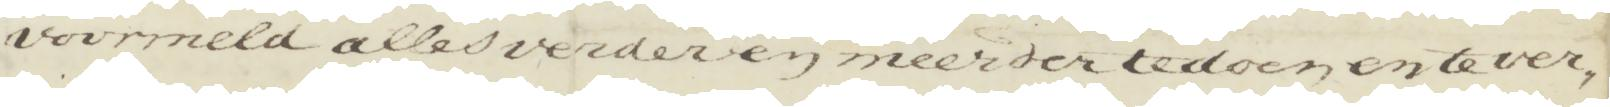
voormeld alles verder en meerder te doen en te ver„
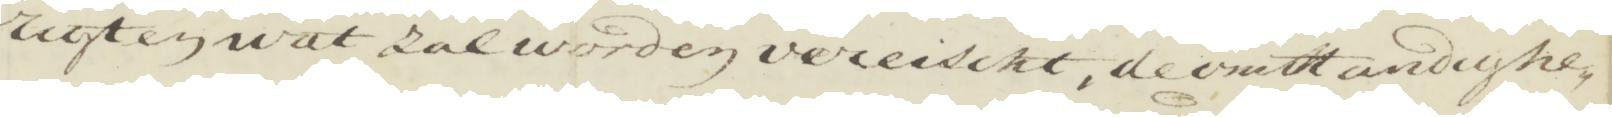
rigten wat zal worden vereischt, de omstandighe„
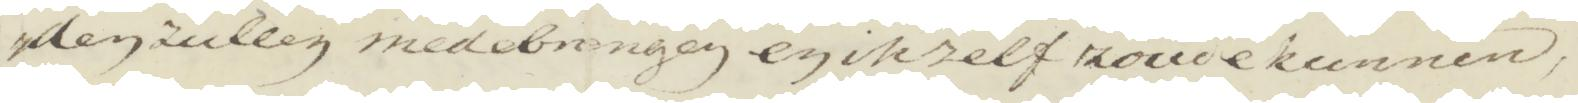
„den zullen medebrengen en ik zelf zoude kunnen,
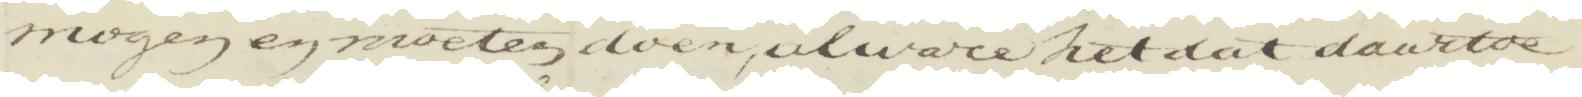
mogen en moeten doen, alware het dat daartoe
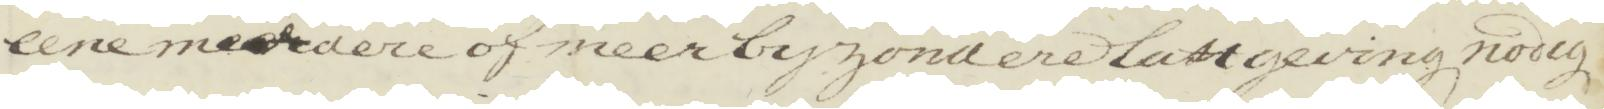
eene meerdere of meer byzondere lastgeving nodig
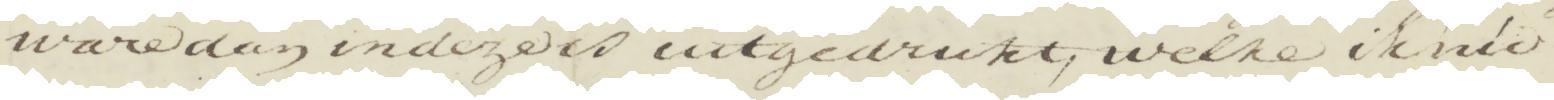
ware dan in deze is uitgedrukt, welke ik nu
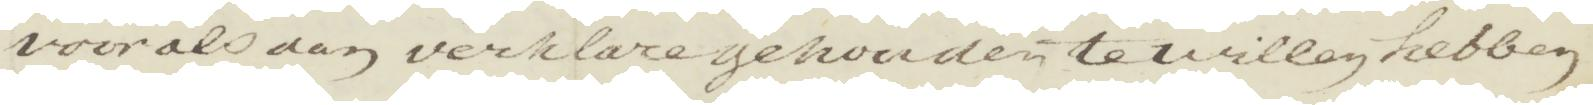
voor als dan verklare gehouden te willen hebben
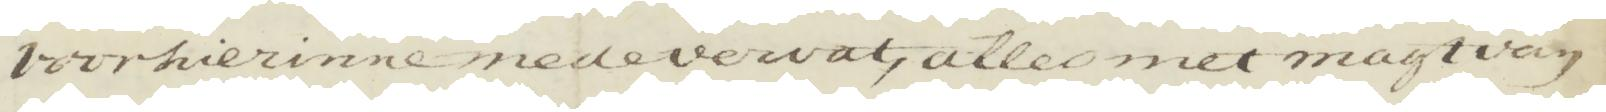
voorhierinne mede vervat, alles met magt van
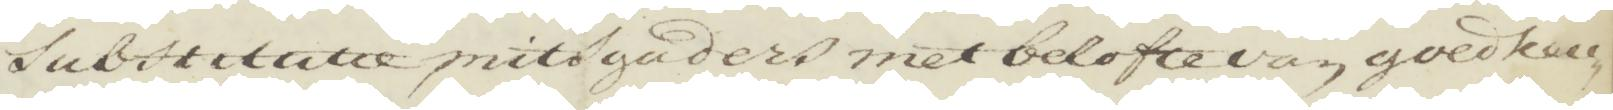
substitutie mitsgaders met belofte van goedkeu„
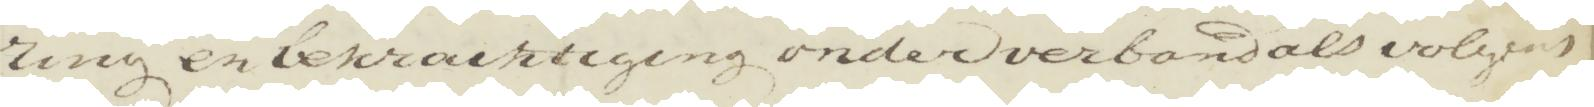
ring en bekrachtiging onder verband als volgens
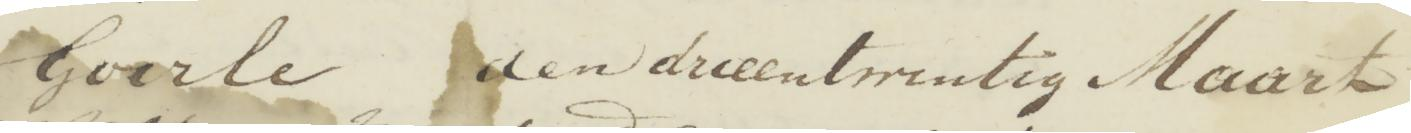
Goirle den drieentwintig Maart
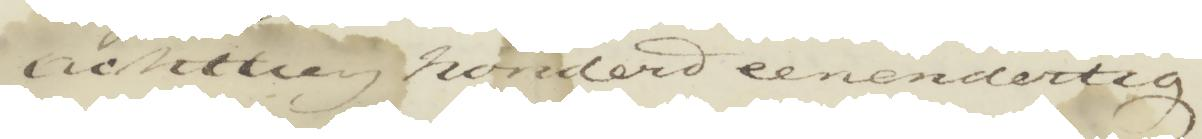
Achttien honderd eenendertig
